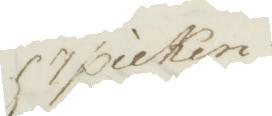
7 pieken
